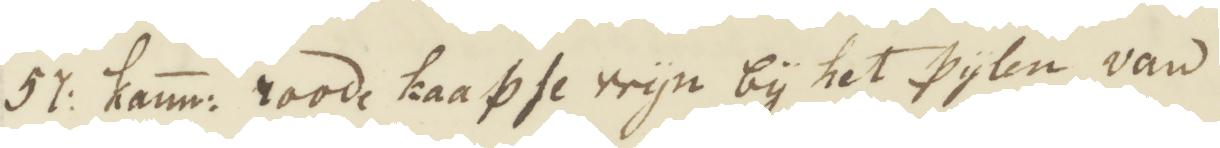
57: kann: roode kaapse wijn bij het pijlen van
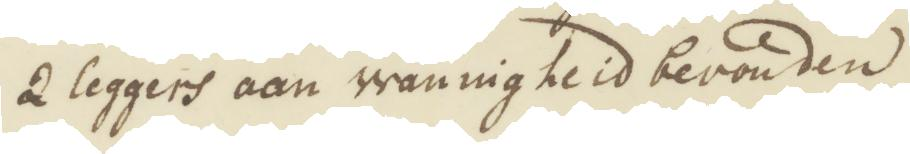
2 leggers aan wannigheid bevonden
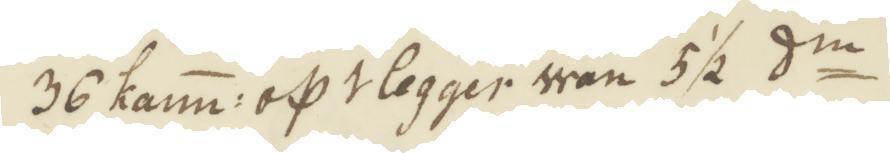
36 kann: op 1 legger wan 5½ d=m
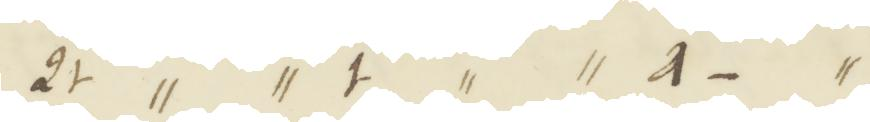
21 „ „ 1 „ „ 4 — „
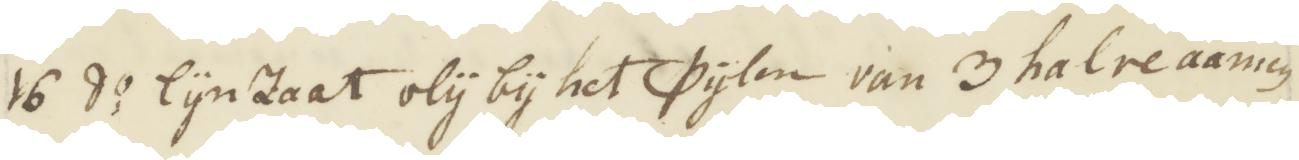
16 d:o lijn zaat olij bij het pijlen van 3 halve aamen
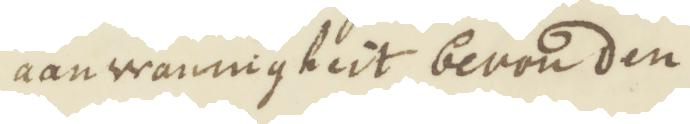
aan wannigheit bevonden
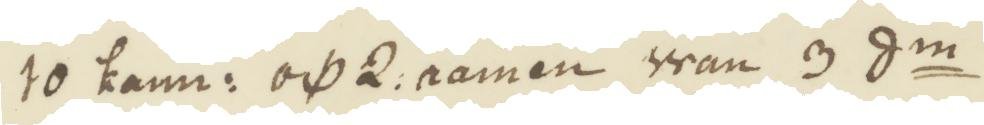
10 kann: op 2: aamen wan 3 d=m
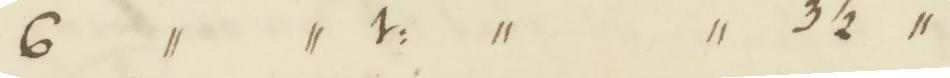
6 „ „ 1: „ „ 3½ „
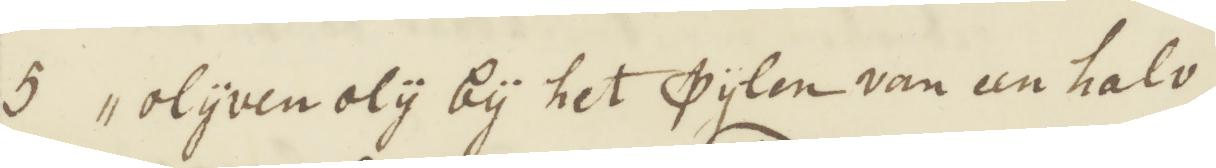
5 „ olijven olij bij het pijlen van een halv
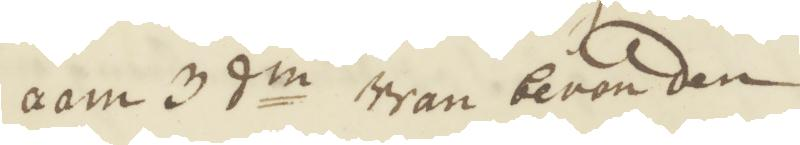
aam 3 d=m wan bevonden
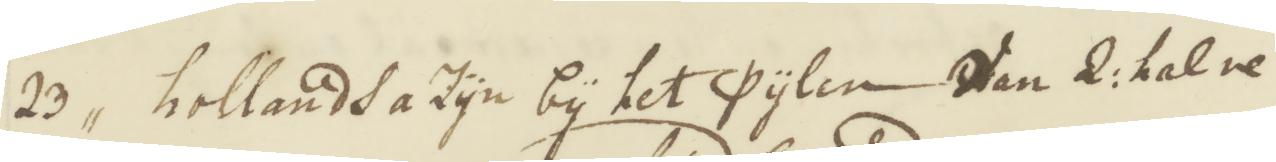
23 „ hollands azijn bij het pijlen van 2: halve
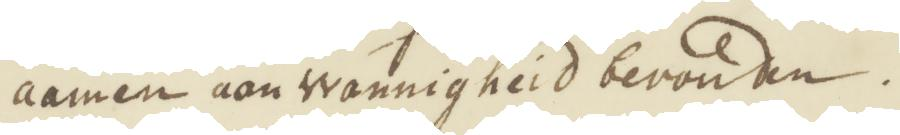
aamen aan wannigheid bevonden.
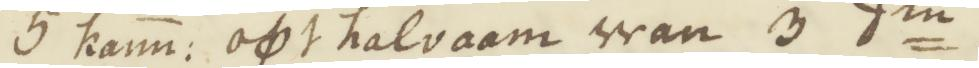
5 kann: op 1 halv aam wan 3 d=m
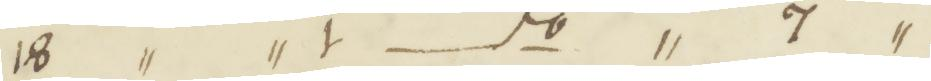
18 „ „ 1 _=o „ 7 „
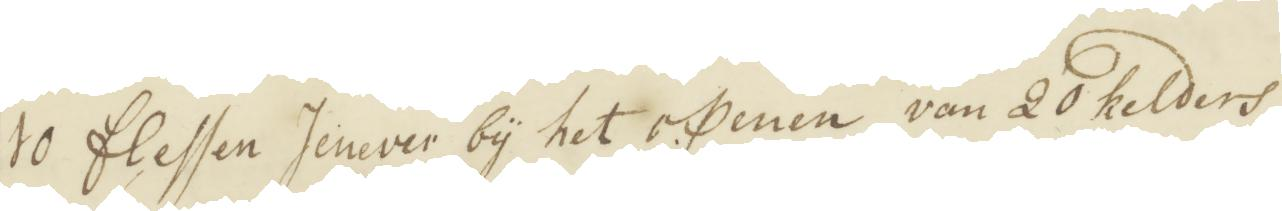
10 flessen Jenever bij het openen van 20 kelders
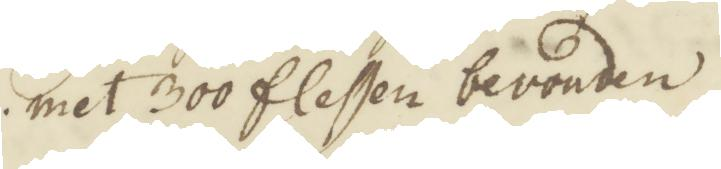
met 300 flessen bevonden
